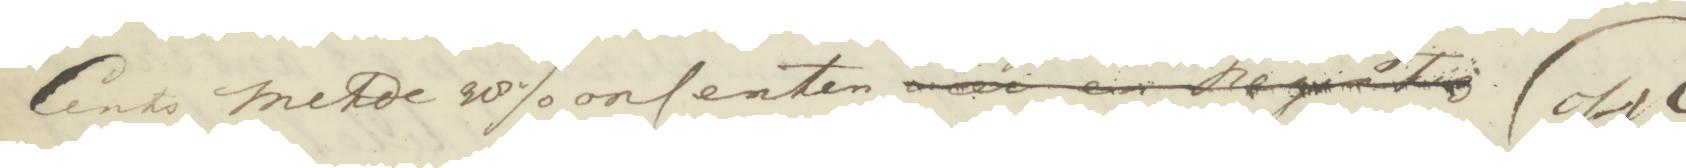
Cents metde 38% opcenten vier en Negentig
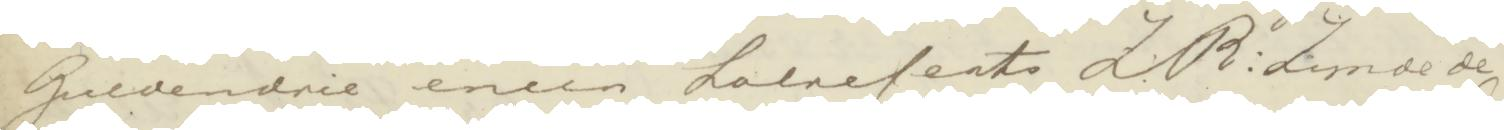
Gulden drie en een halve Cents Z: R: Zynde de
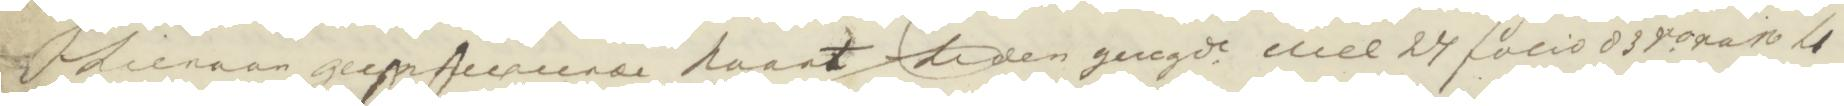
hieraan geinserreerde kaart heden geregi.t deel 27 folio 83 V.o vak 4
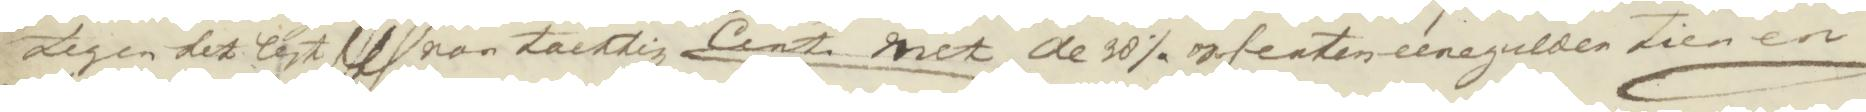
tegen het leyt van tachtig Cent met de 38% opcenten eene gulden tien en
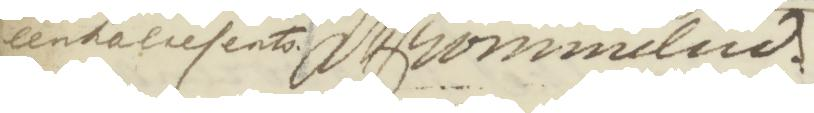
een halve Cents. D:F Crommelin.
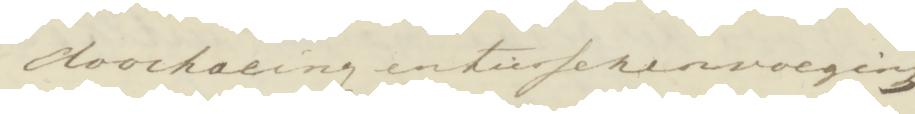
doorhaling en tusschenvoeging
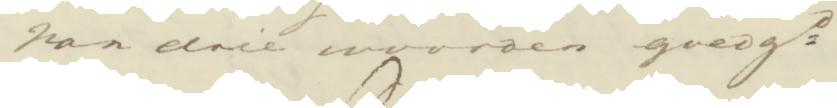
van drie woorden goedg=d
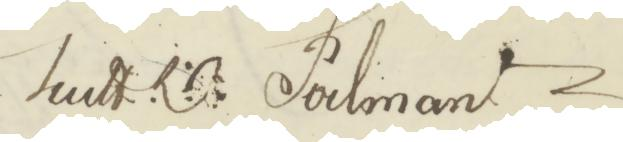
hubb:ht Poelman
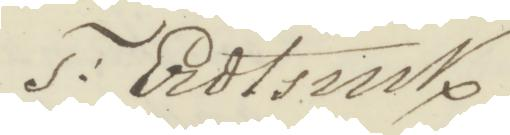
T: Erdtsink
